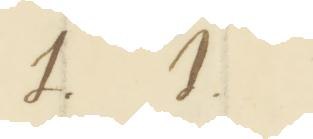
1. 1. 1
